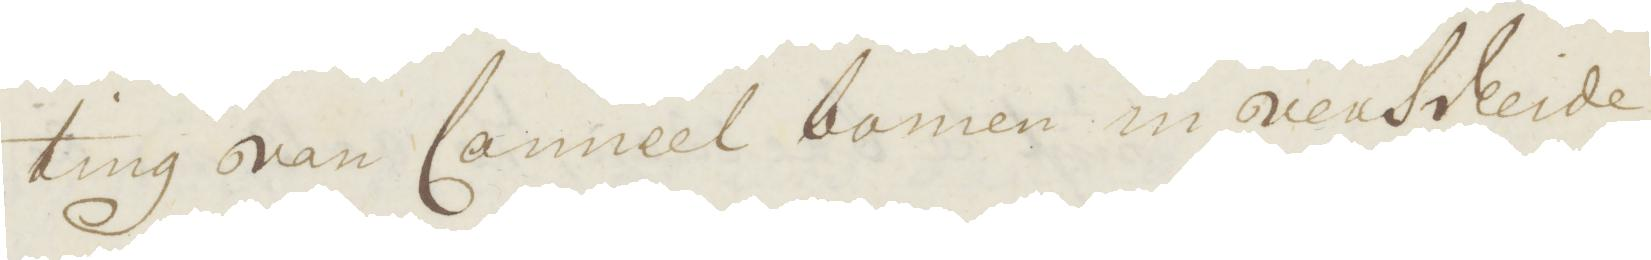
ting van Canneel bomen in verscheide
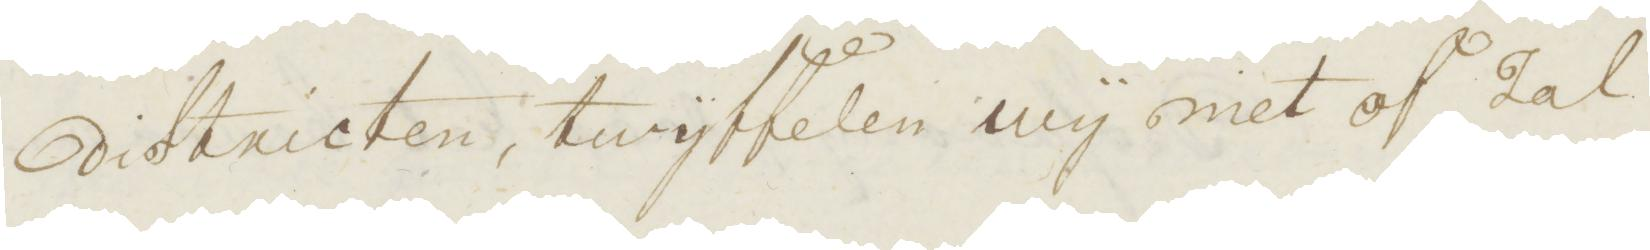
districten, twijffelen wij niet of zal
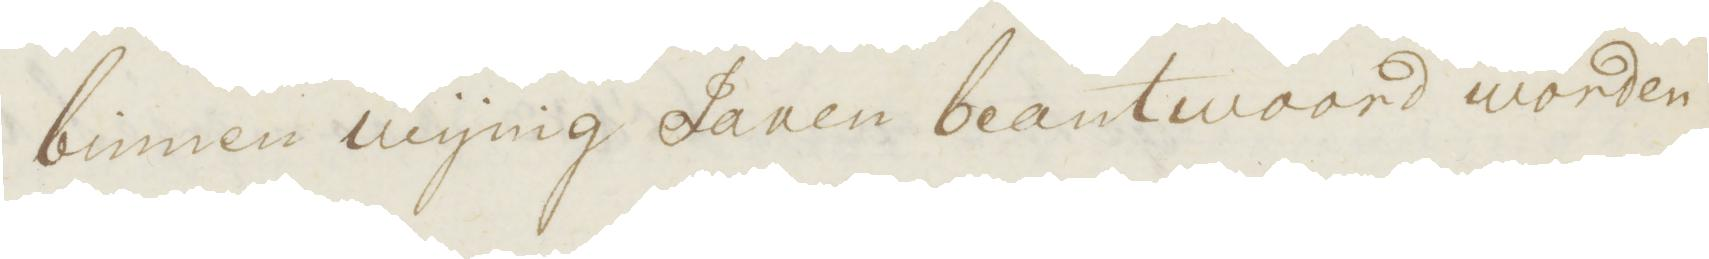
binnen wijnig Iaren beantwoord worden
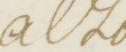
alzo
